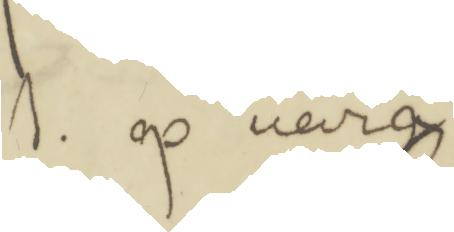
1. op neira
